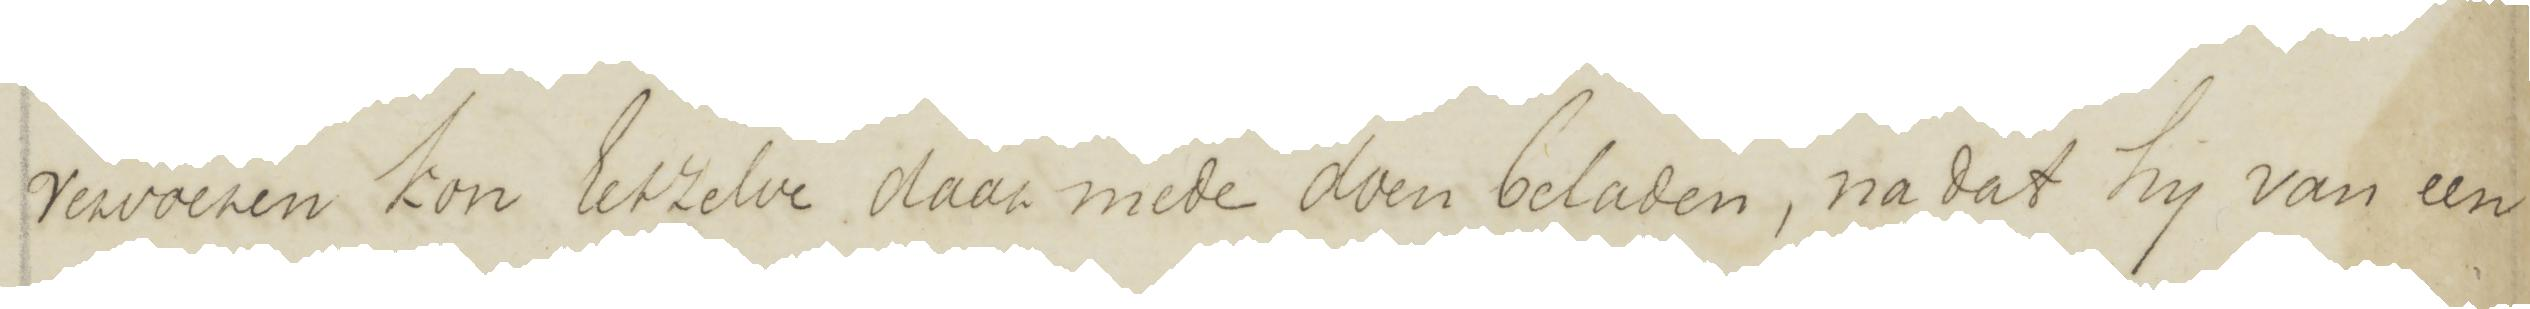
vervoeren kon hetzelve daar mede doen beladen, na dat hij van een
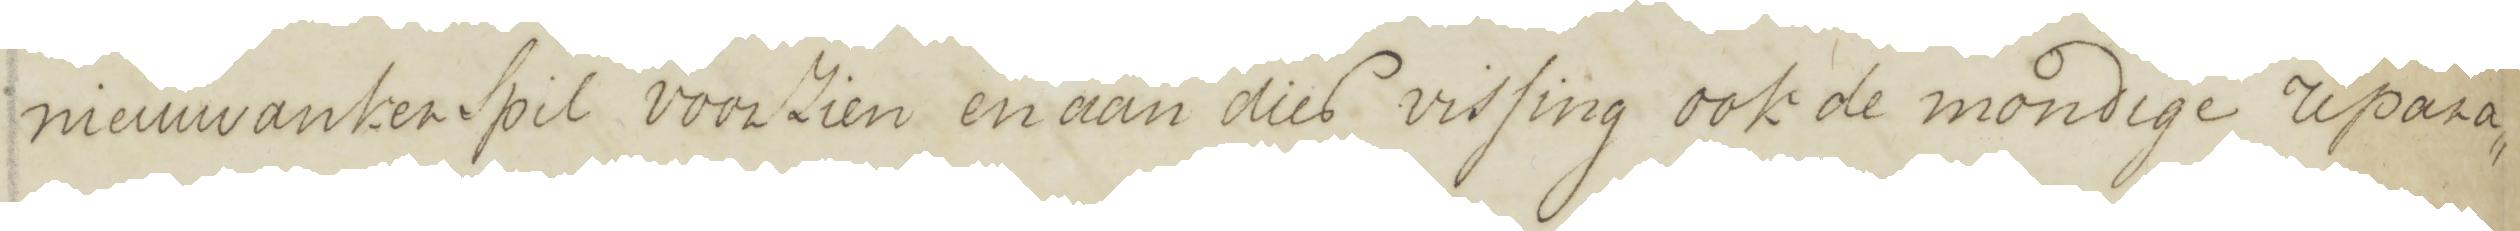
nieuw anker spil voorzien en aan dies vissing ook de mondige repara„
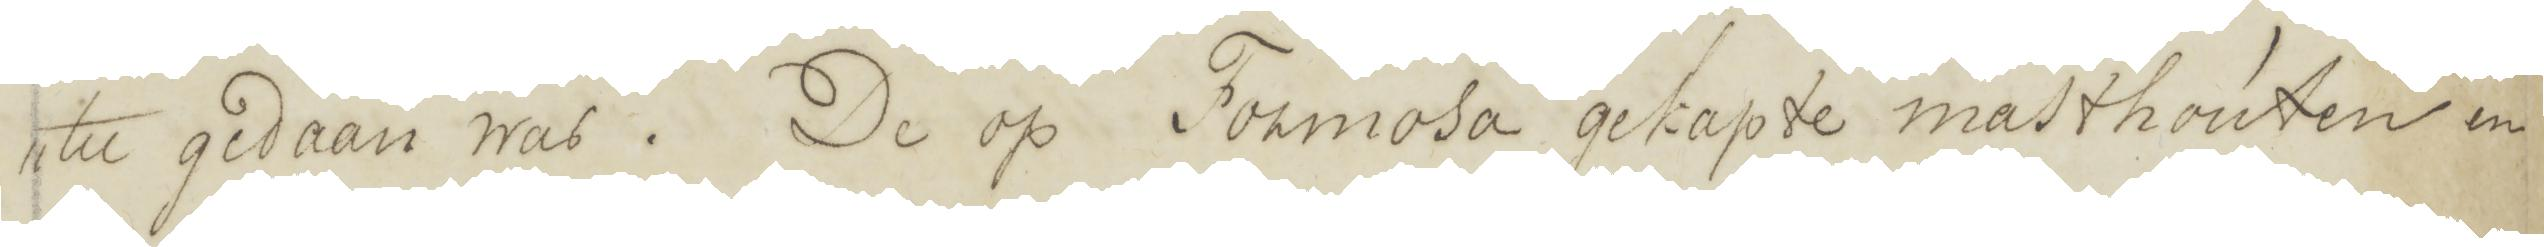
tie gedaan was. De op Formosa gekapte masthouten en
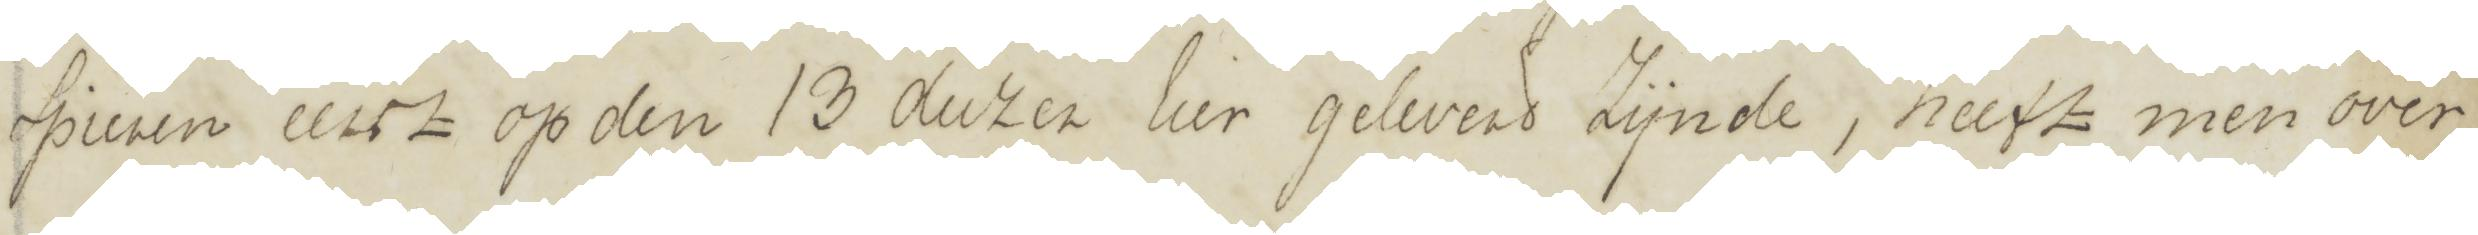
spieren eerst op den 13 deezer hier geleverd zijnde, heeft men over
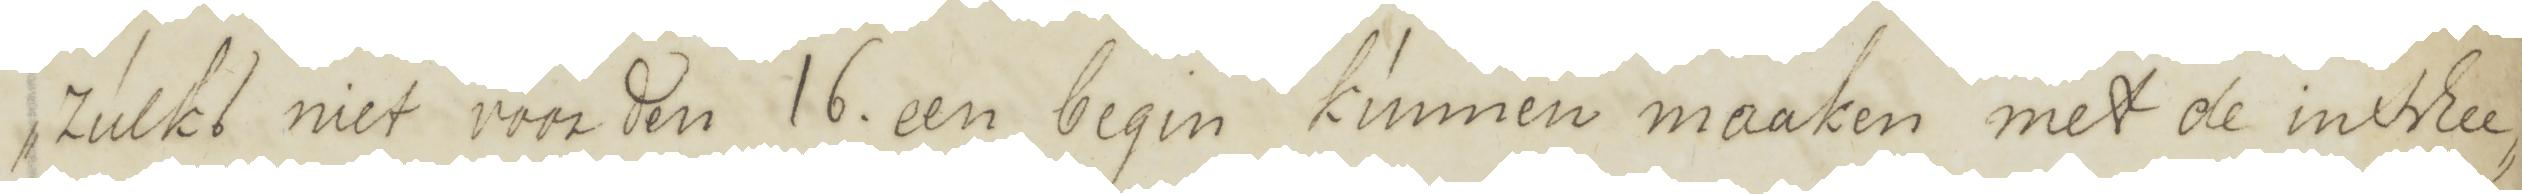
„zulks niet voor den 16. een begin kunnen maaken met de inschee
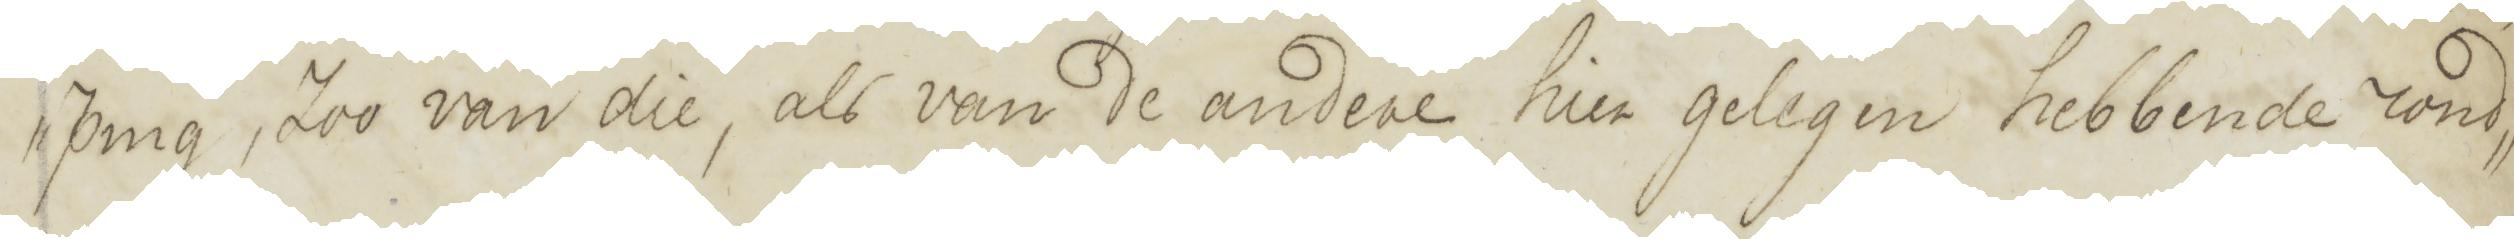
„ping, zoo van die, als van de andere hier gelegen hebbende rond
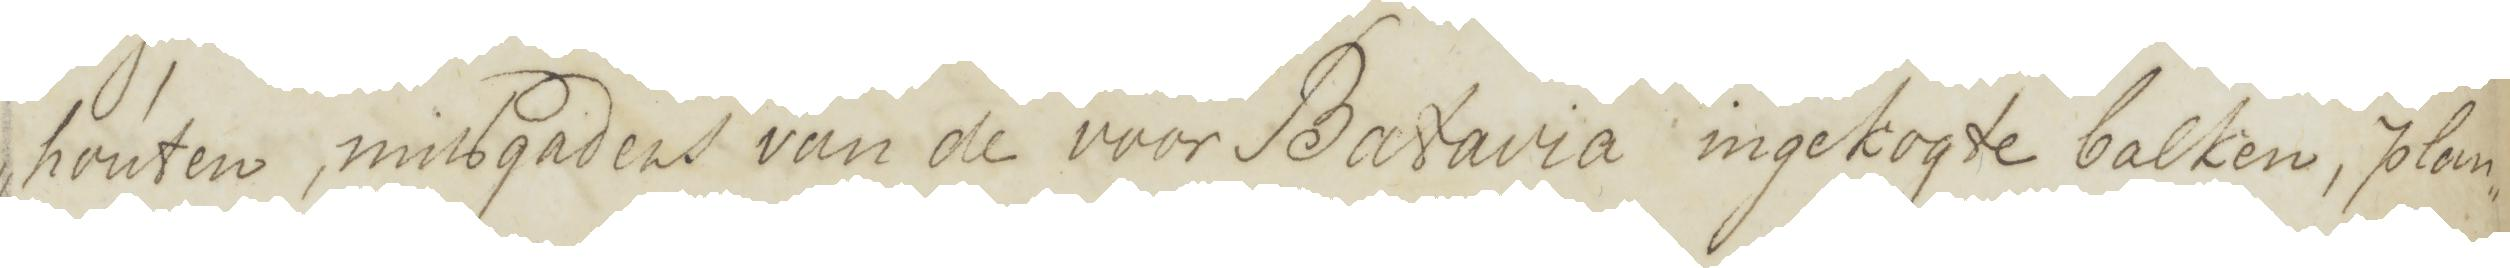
houten, mitsgaders van de voor Batavia ingekogte balken, plan
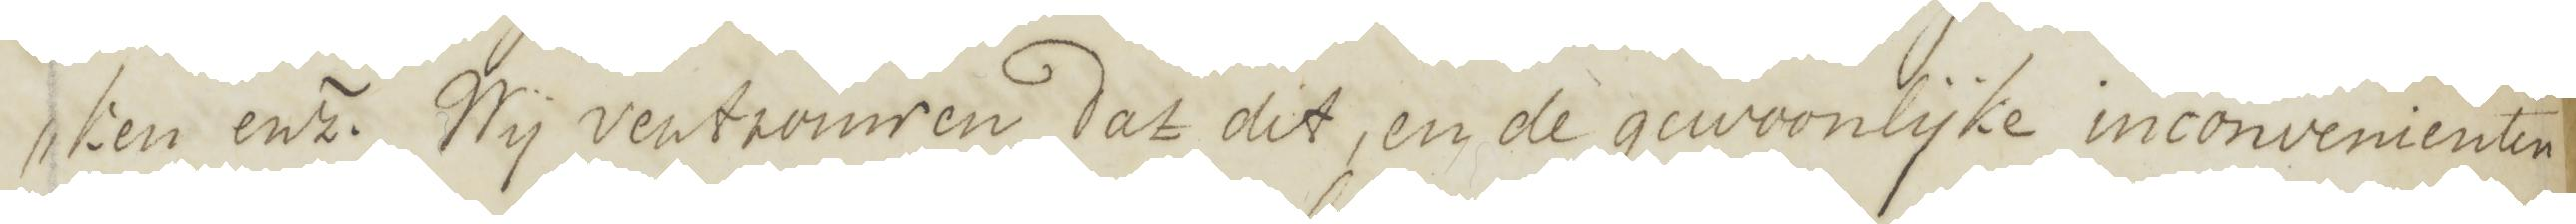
„ken enz. Wij vertrouwen dat dit, en de gewoonlijke inconvenienten
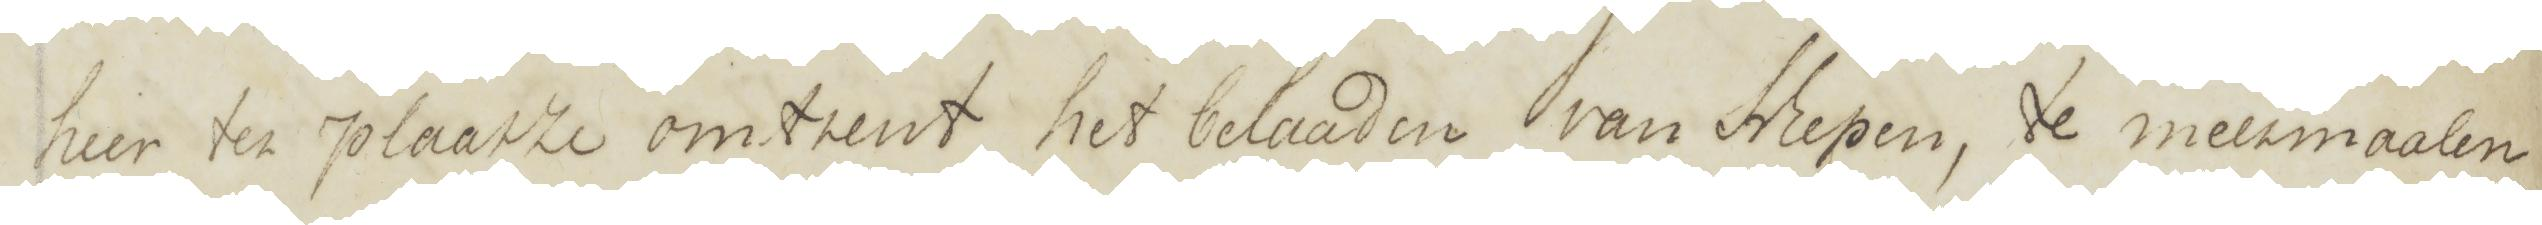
hier ter plaatze omtrent het belaaden van schepen, te meermaalen
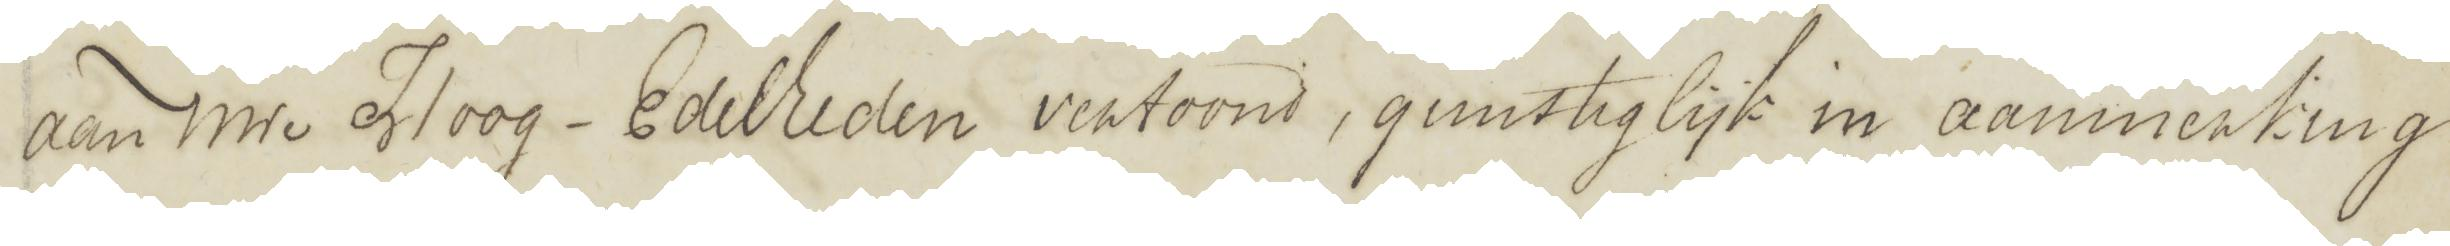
aan uwe Hoog-Edelheden vertoond, gunstiglijk in aanmerking
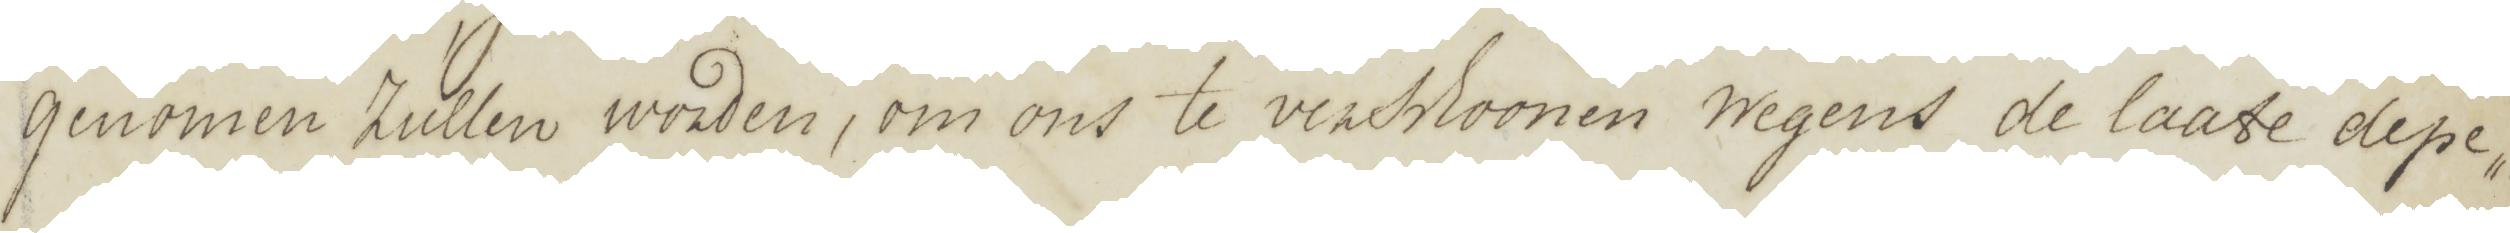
genomen zullen worden, om ons te verschoonen wegens de laate depe
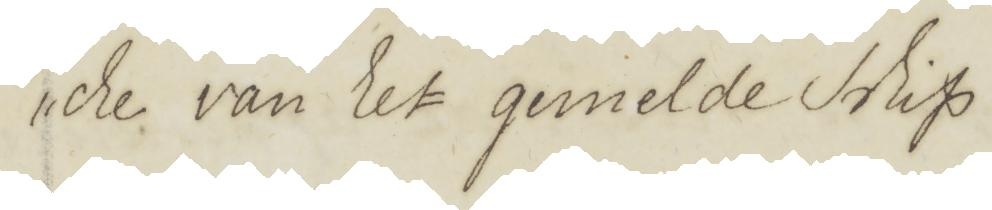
che van het gemelde schip
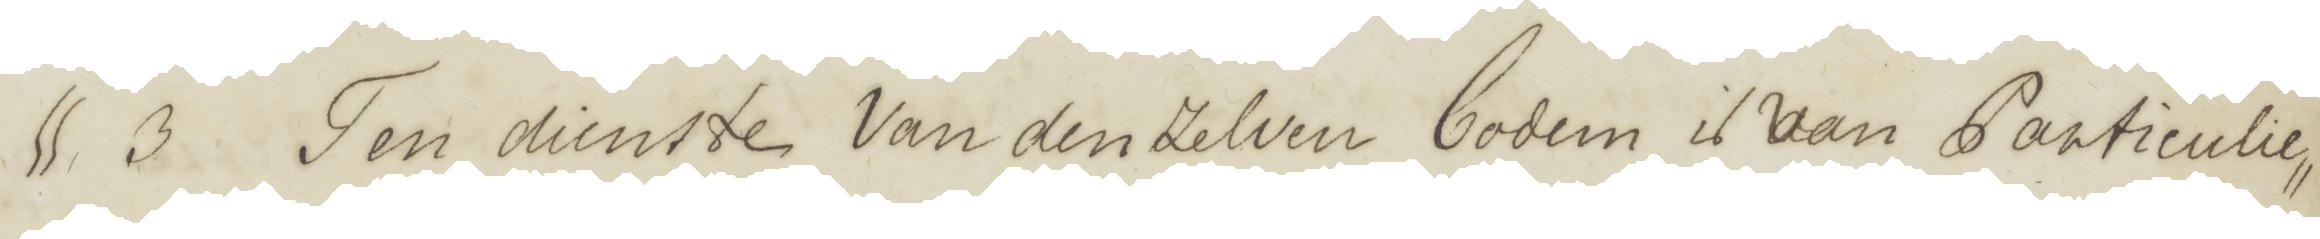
§ 3 Ten dienste van denzelven bodem is van Particulie„
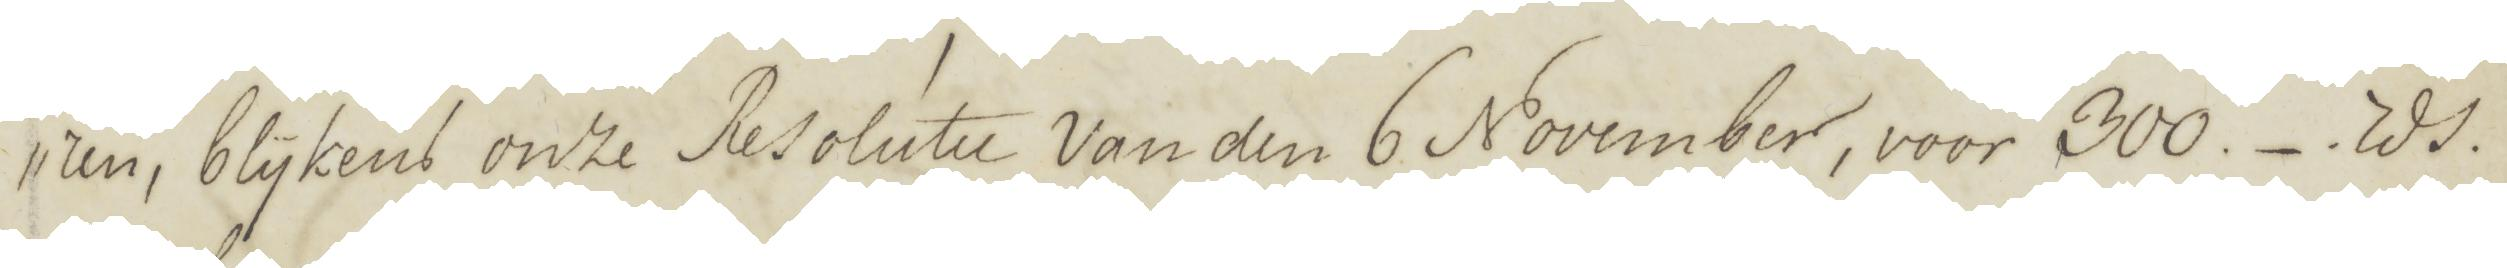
„ren, blijkens onze Resolutie van den 6 November, voor 300.—. rds.
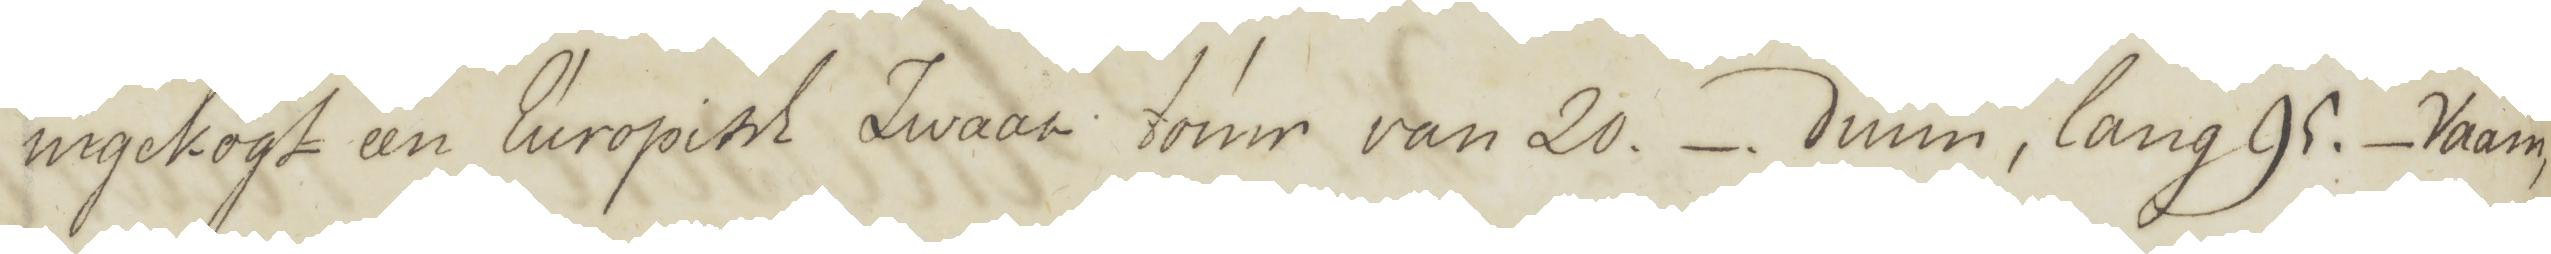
ingekogt een Europisch zwaar touw van 20. —. duim, lang 95.— Vaam,
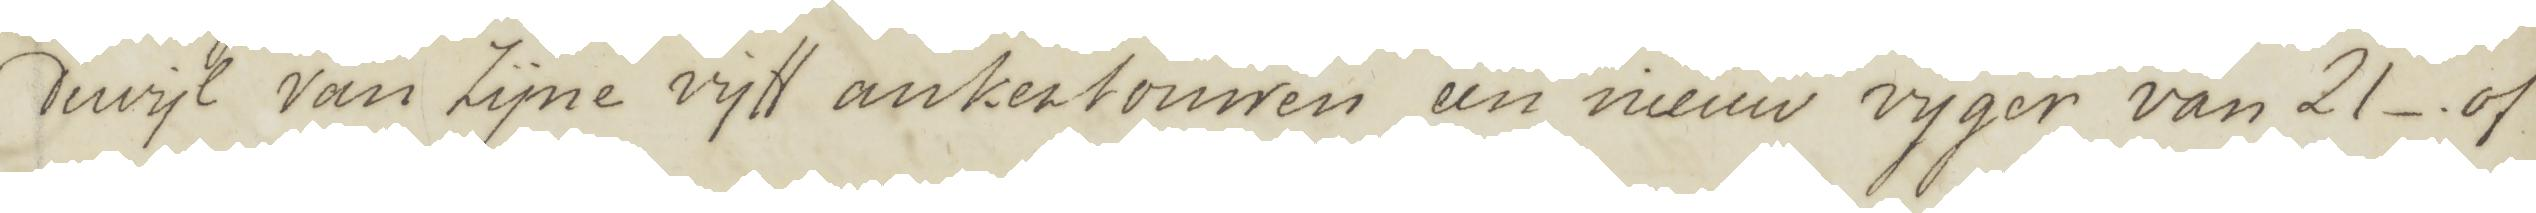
dewijl van zijne vijf ankertouwen een nieuw vijger van 21—. of
